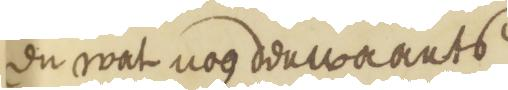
en wat nog derwaarts
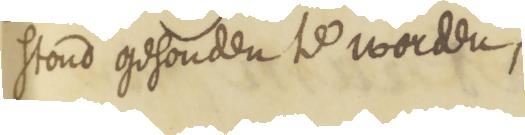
stond gesonden te worden,
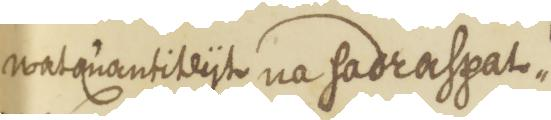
wat quantiteijt na sadraspat„
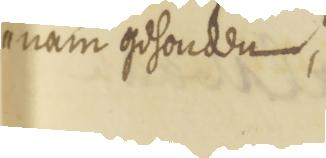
nam gesonden,
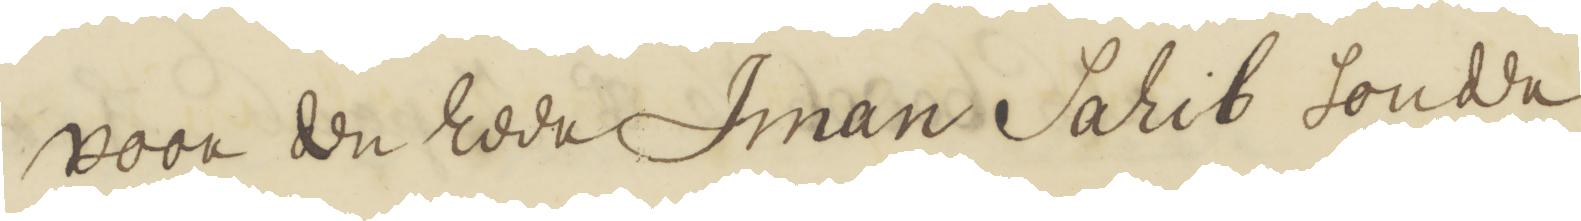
voor den heer Iman Sahib sonder
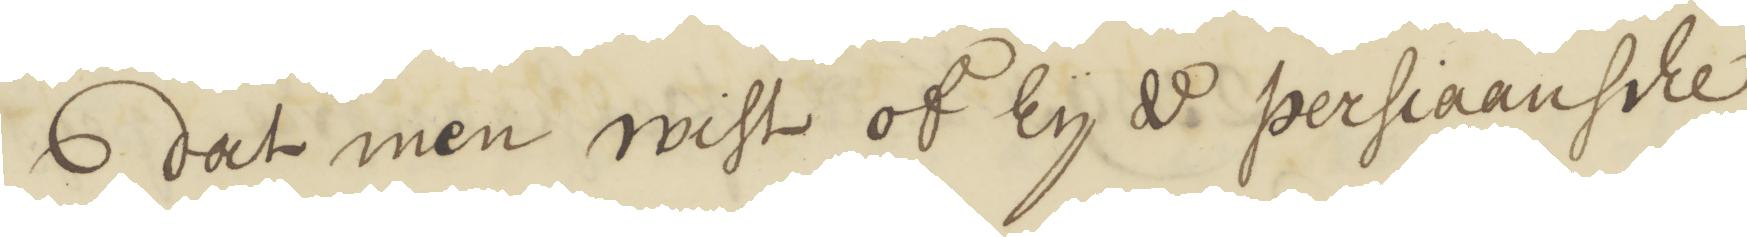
dat men wist of hij de persiaansche
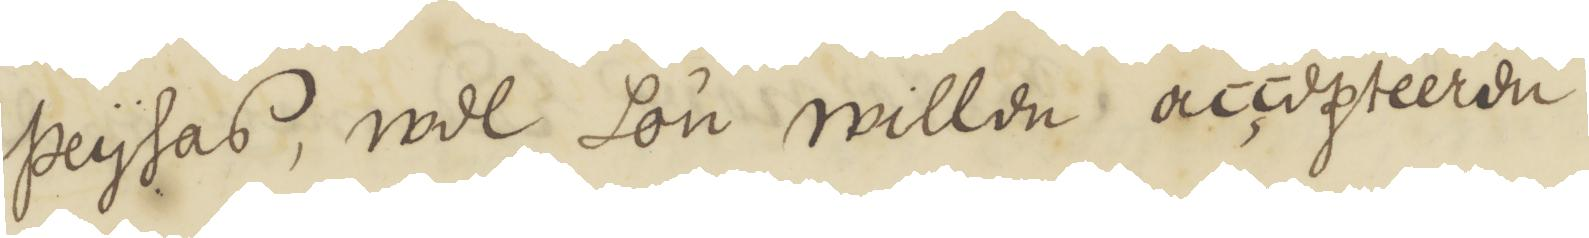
peijsas, wel sou willen accepteeren
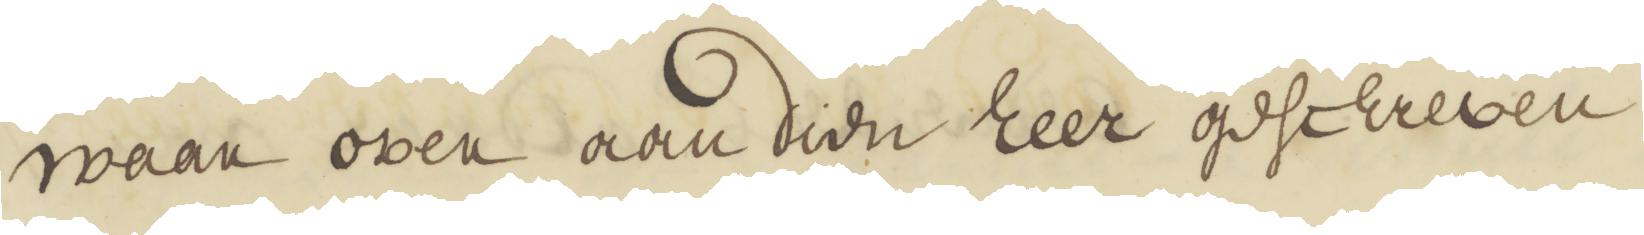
waar over aan dien heer geschreven
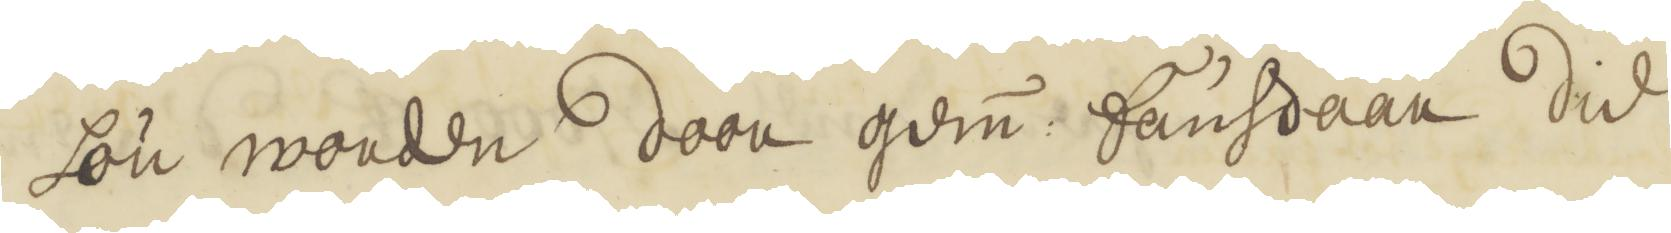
sou worden door gem: fausdaar die
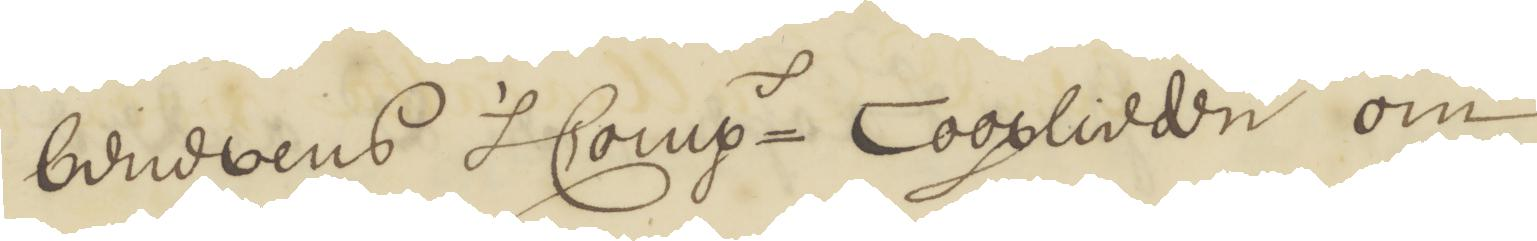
benevens ’SComp=s Cooplieden om
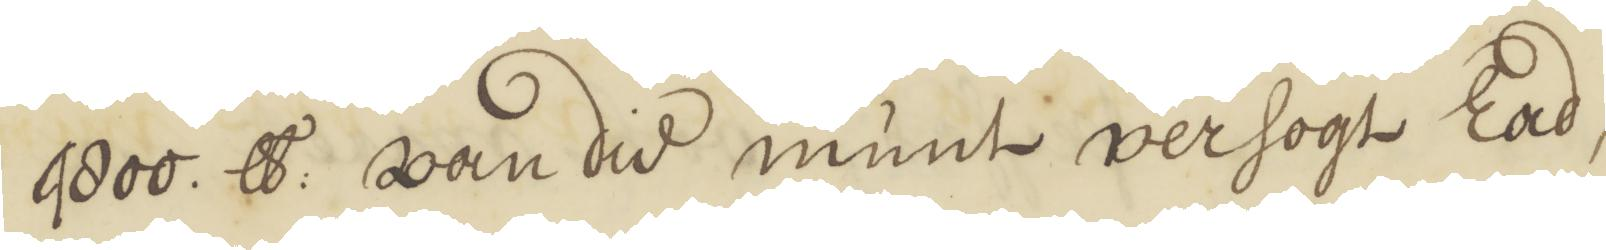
4800. lb: van die munt versogt had,
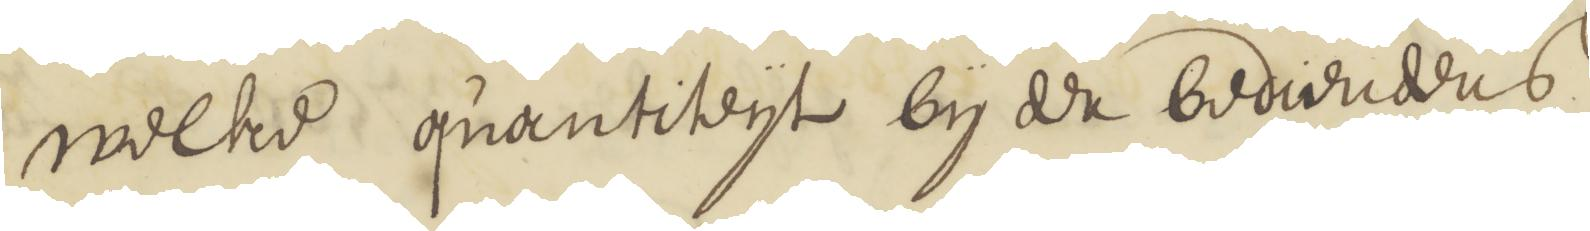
welke quantiteijt bij der bediendens
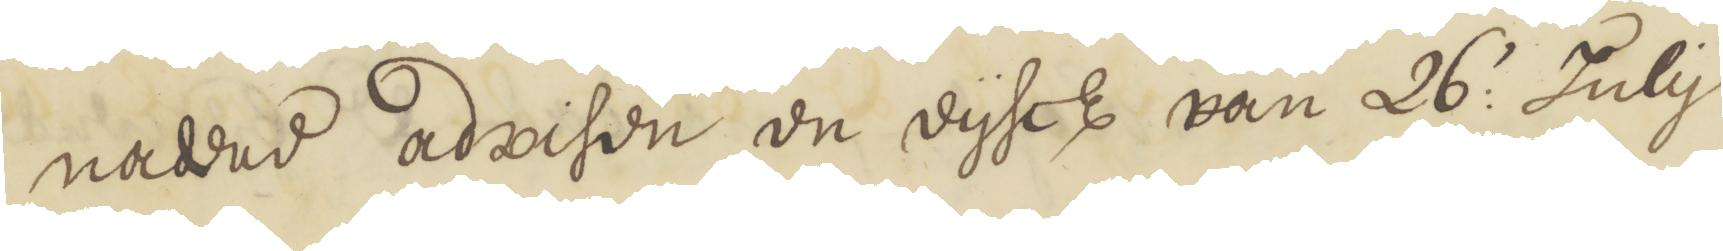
nadere advisen en eijsch van 26:' Julij
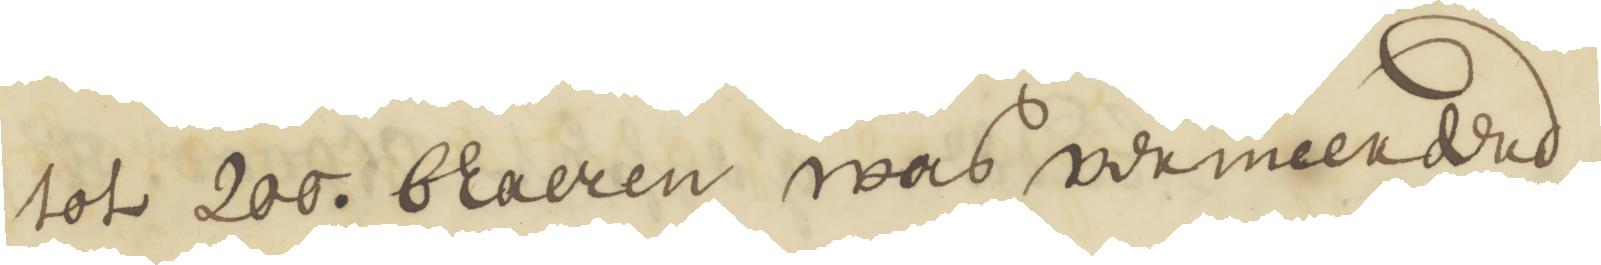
tot 200. bhaeren was vermeerderd,
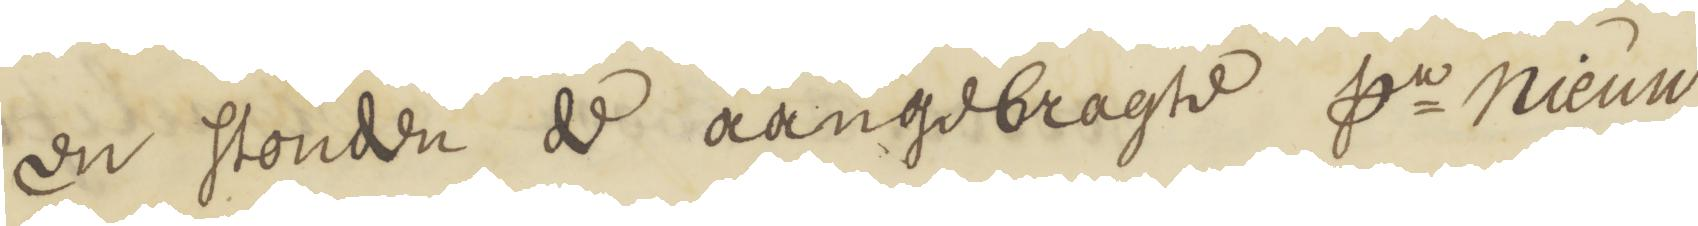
en stonden de aangebragte p=r Nieuw
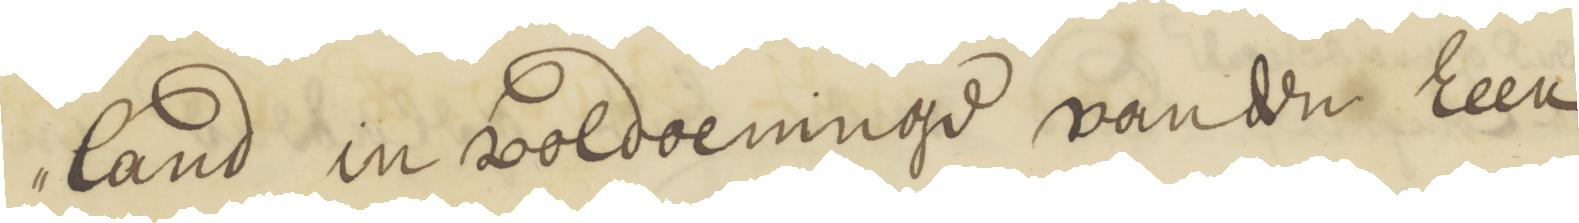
„land in voldoeninge van den heer
